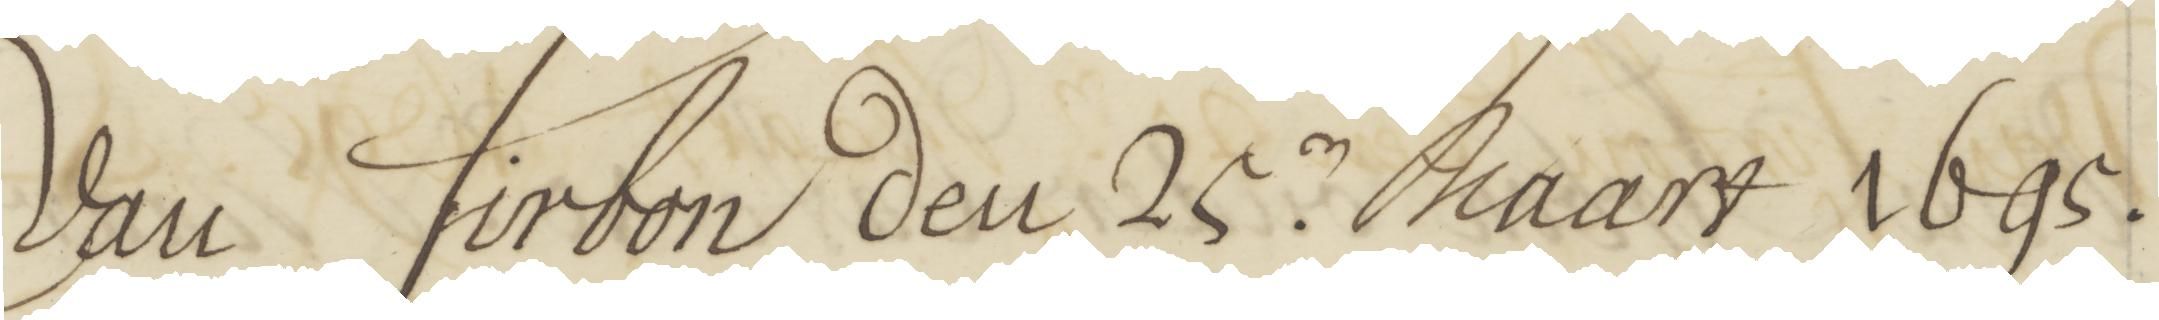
Van Sirbon den 25:en Maart 1695.
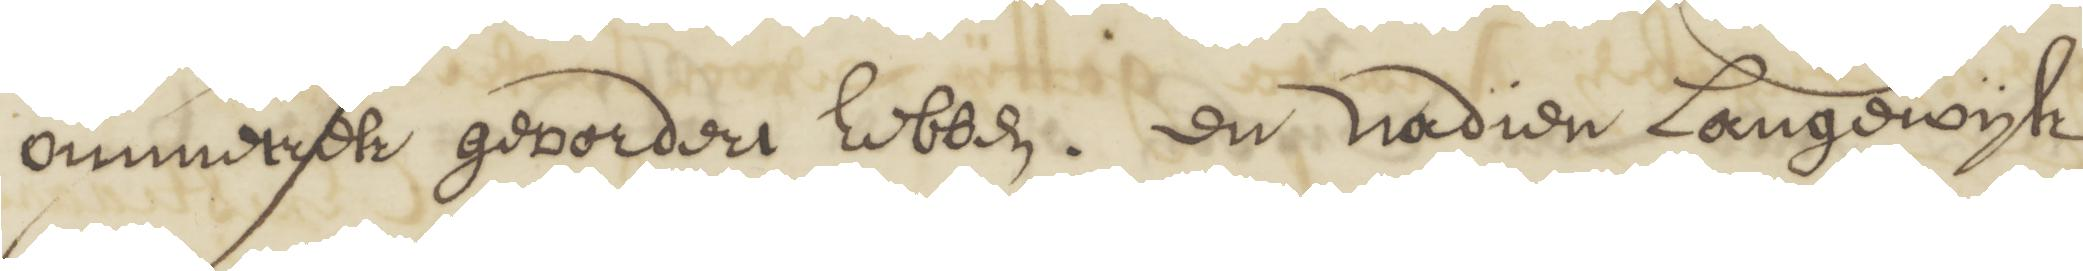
ommetrek gevordert hebben. en nadien langewijk
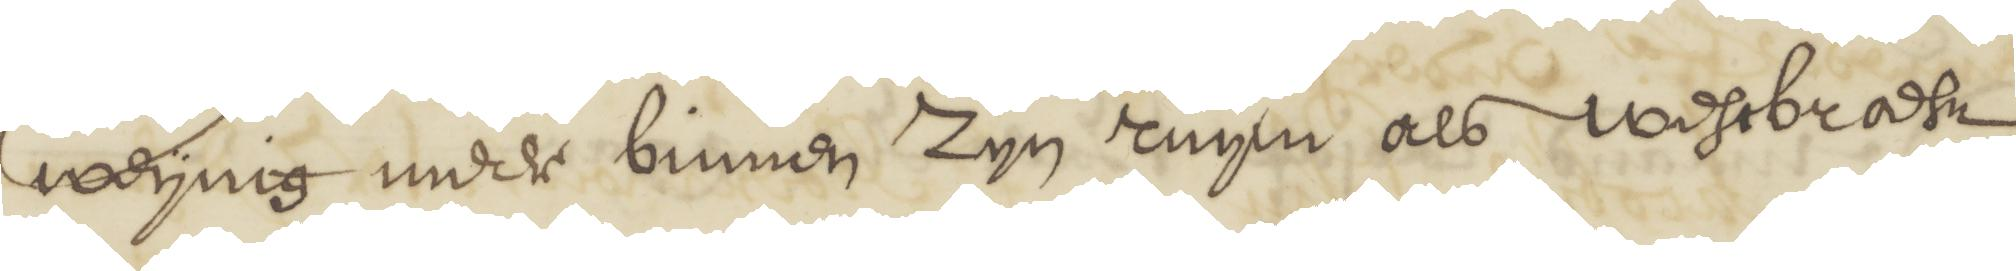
weijnig meer binnen zijn ruijm als westbroek
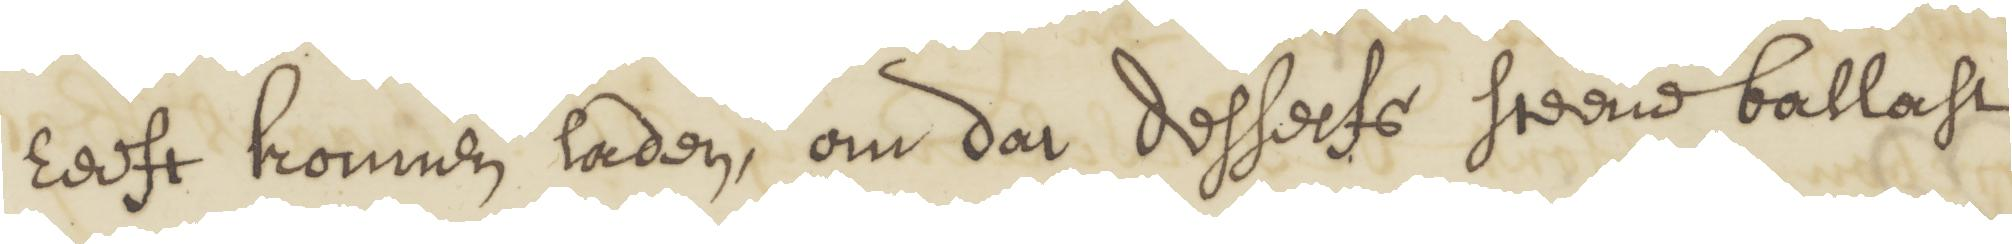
heeft konnen laden, om dat desselfs steene ballast
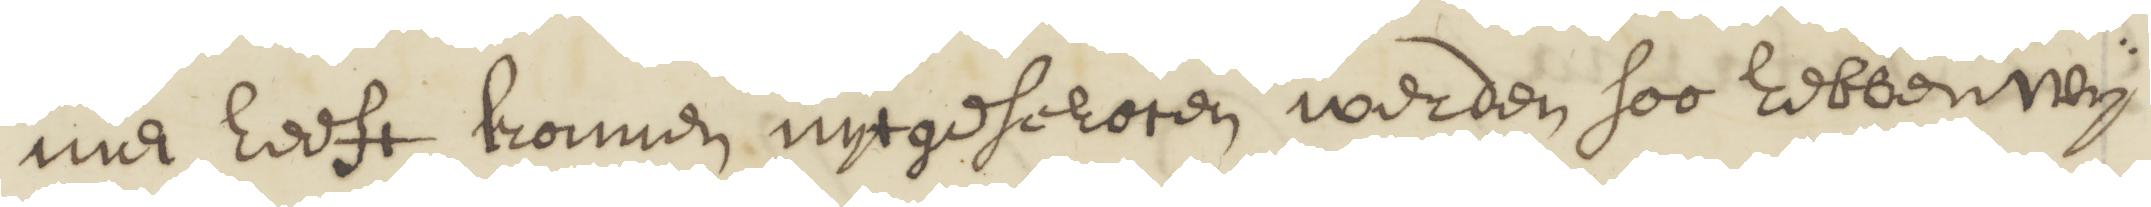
niet heeft konnen uijtgeschoten werden soo hebben wij
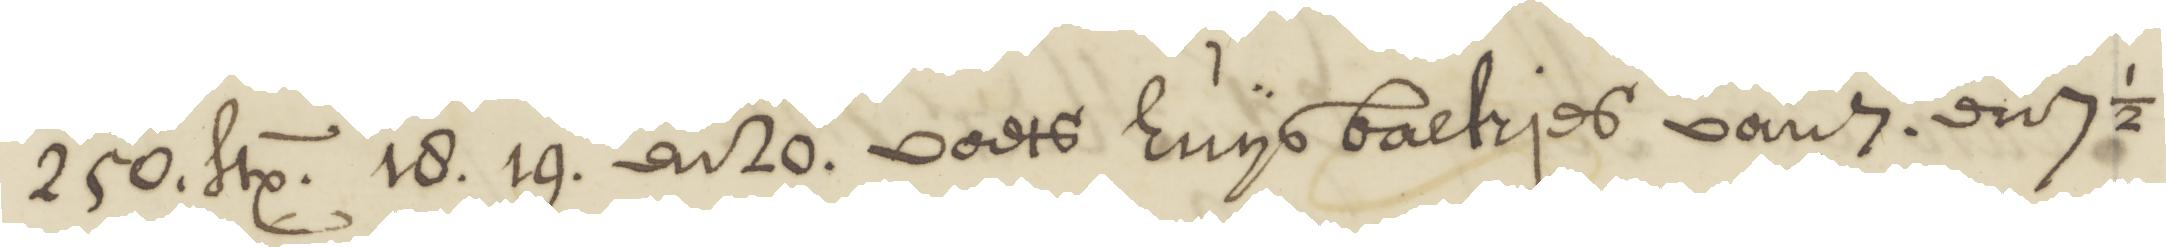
250. stx. 18. 19. en 20. voets huijsbalkjes van 7. en 7½
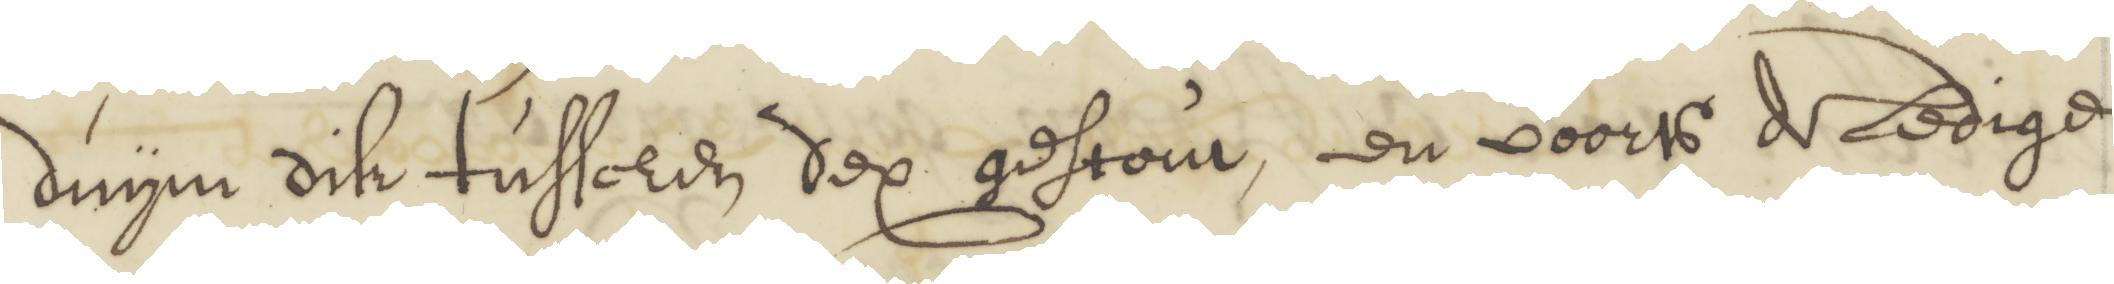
duijm dik tusschen dex gestout, en voorts de ledige
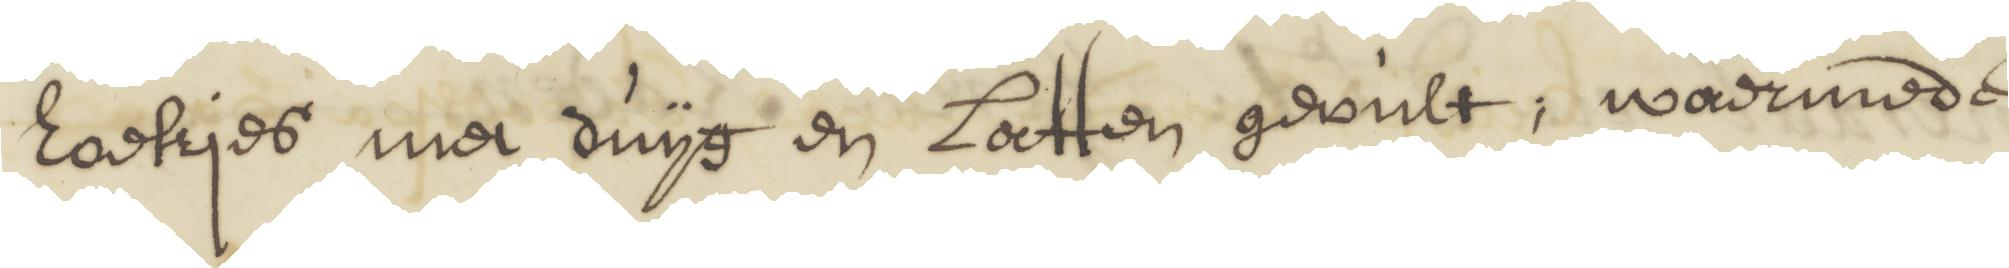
hoekjes met duijg en latten gevult; waermede
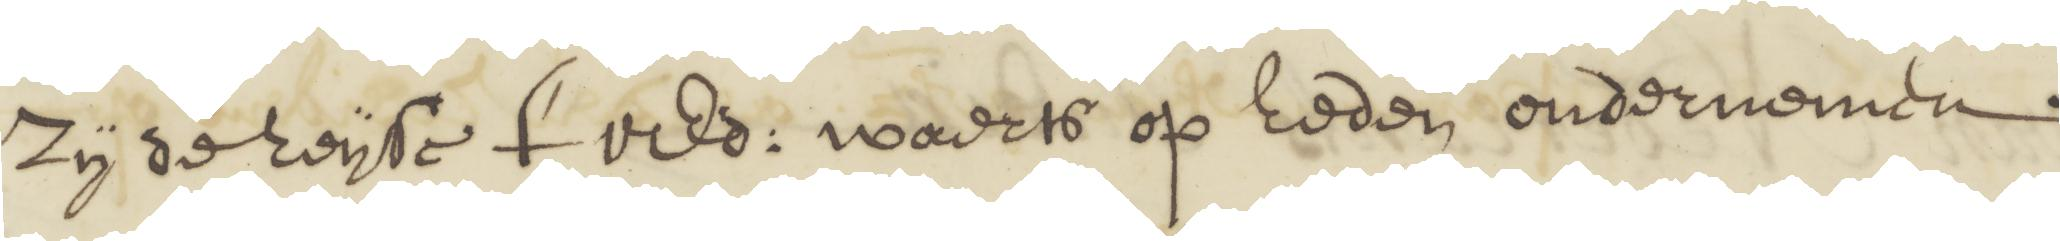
zij de reijse t' vEd: waerts op heden ondernemen
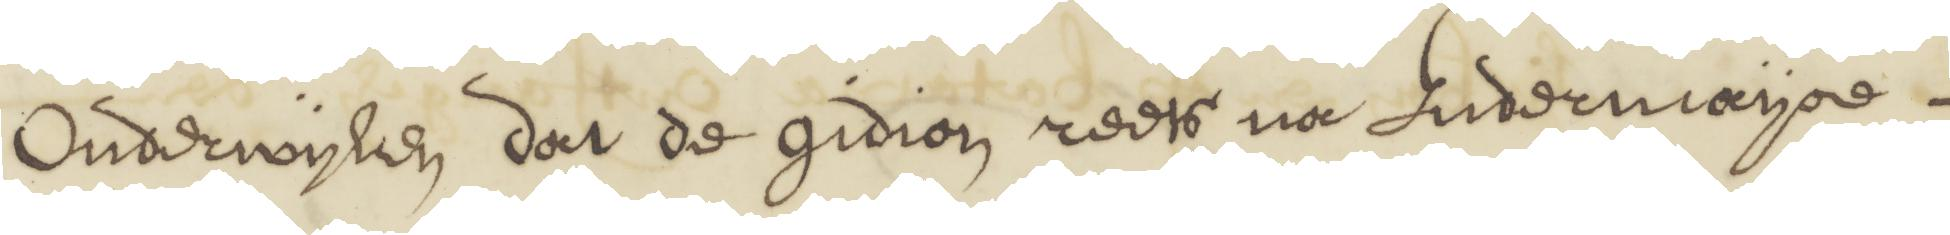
Onderwijlen dat de gidion reets na Jndermaijoe
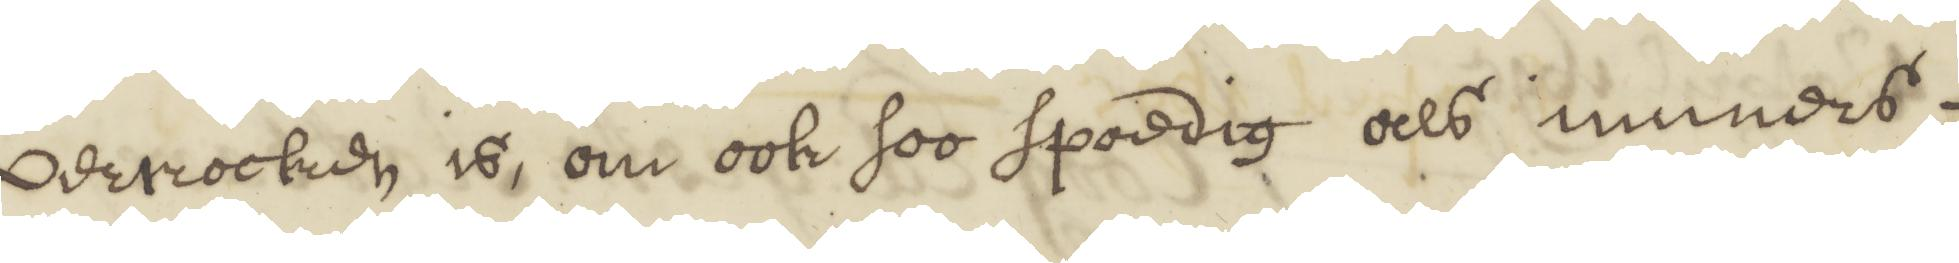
vertrocken is, om ook soo spoedig als immers
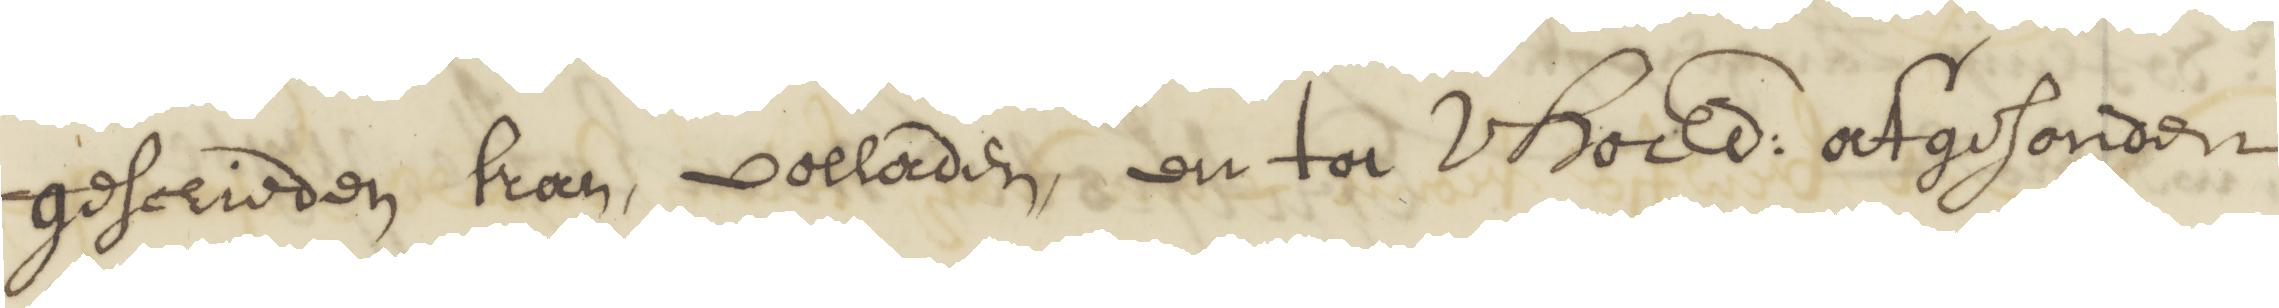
geschieden kan, volladen, en tot vHoEd: afgesonden
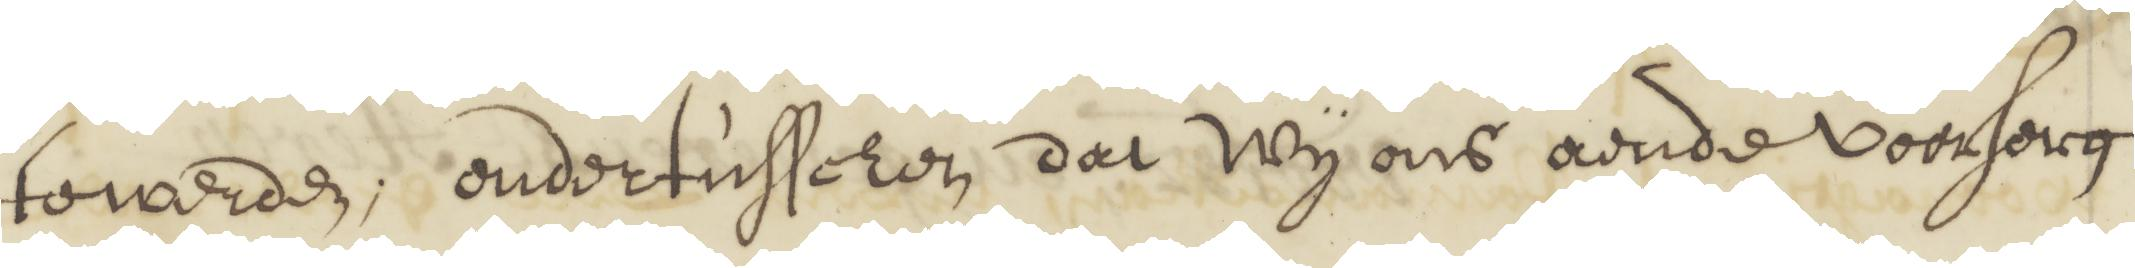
te werden; ondertusschen dat wij ons aende voorsorg
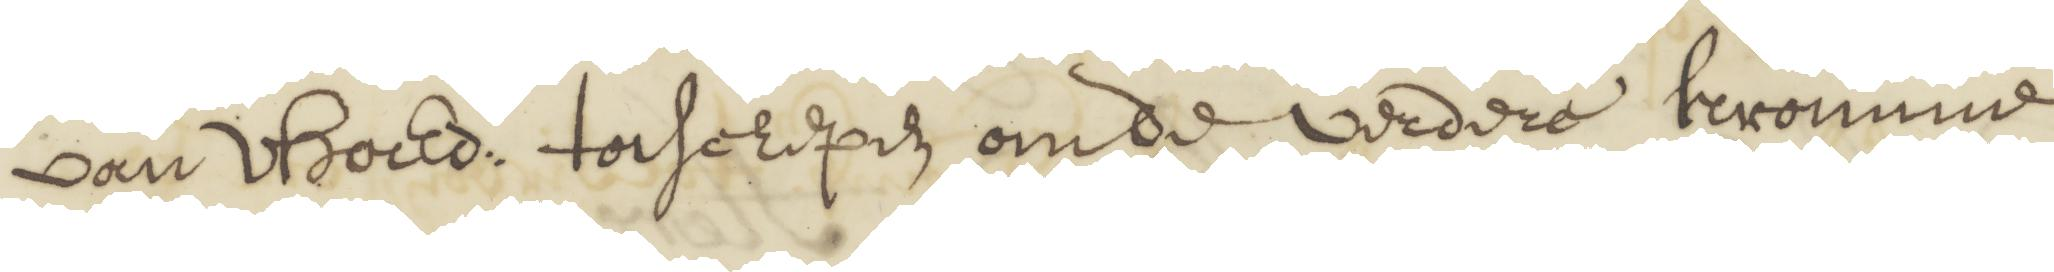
van vHoEd: totschepen om de verdere kromme
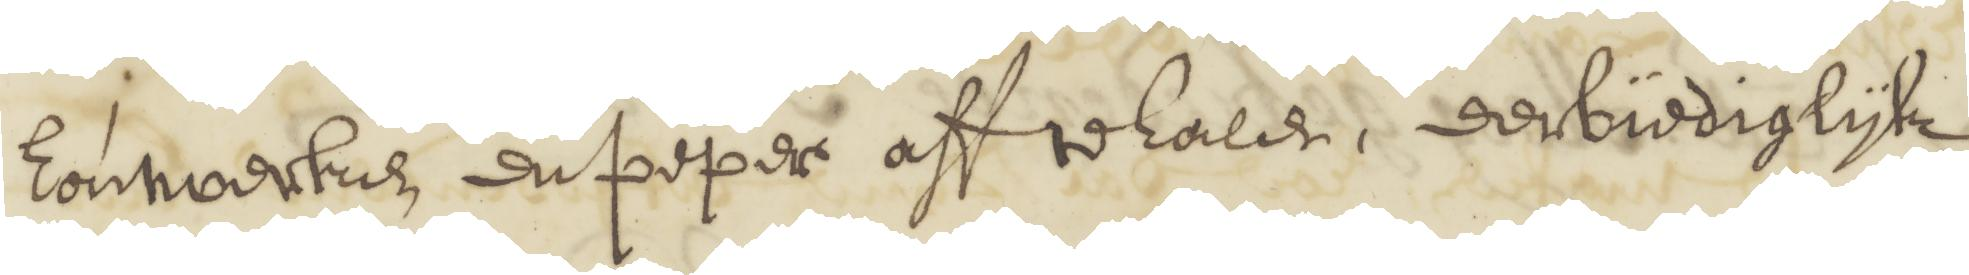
houtwerken en peper afftehalen, eerbiediglijk
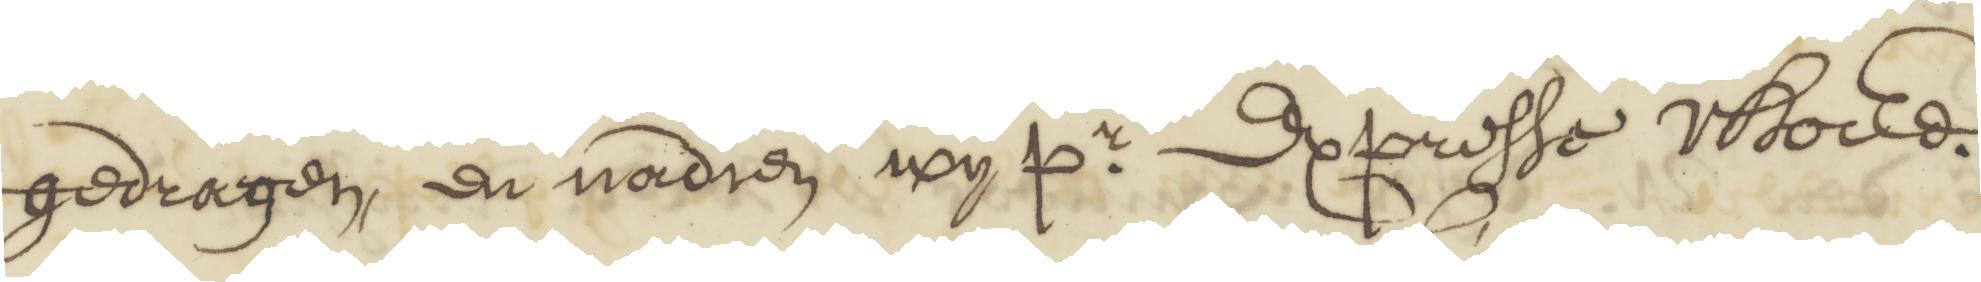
gedragen, en nadien wij p.r Expresse vHoEd.
